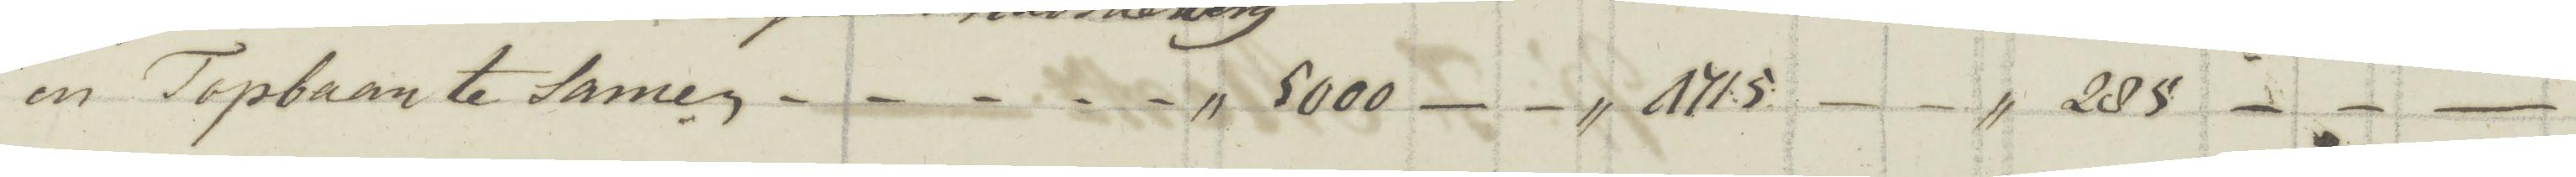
en Topbaan te samen – – – – – „ 5000 — — „ 4715 — — „ 285 — — —
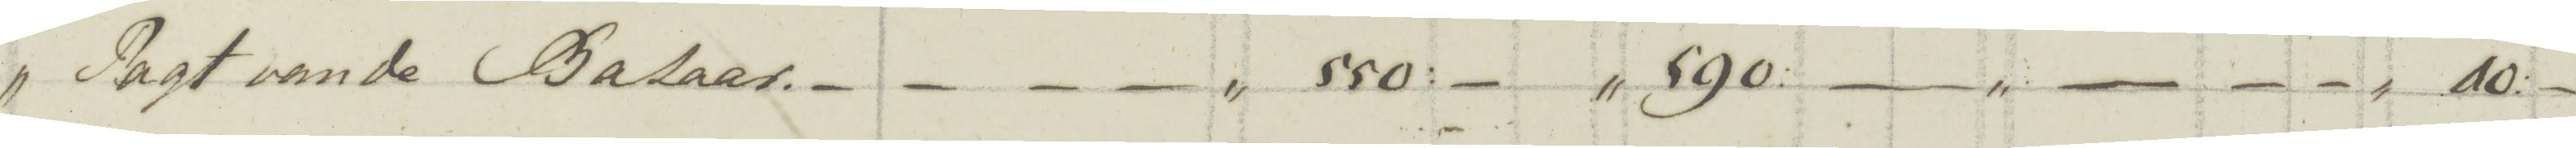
„ Pagt van de Basaar. — — — — „ 550: — „ 590: — „ — — — „ 40: —
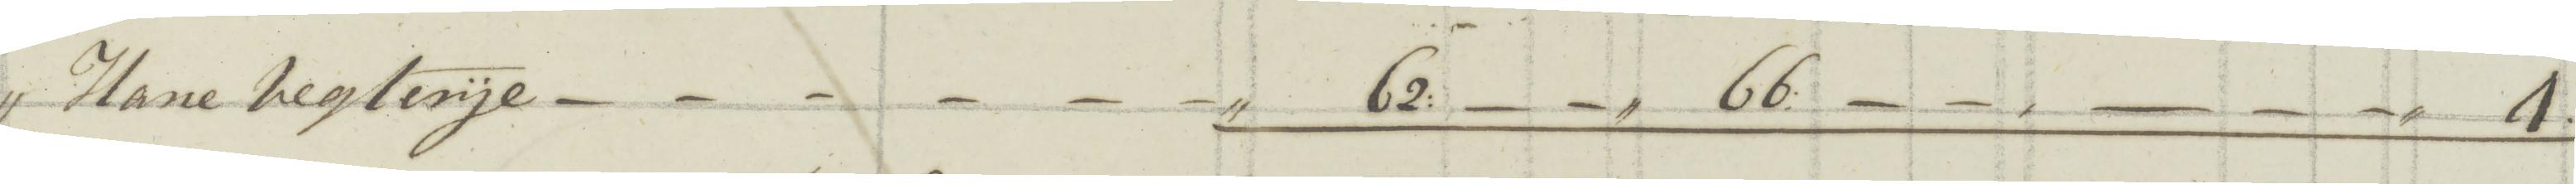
„ Hane vegterije — — — — — — „ 62: — — „ 66 — — „ — — — „ 4
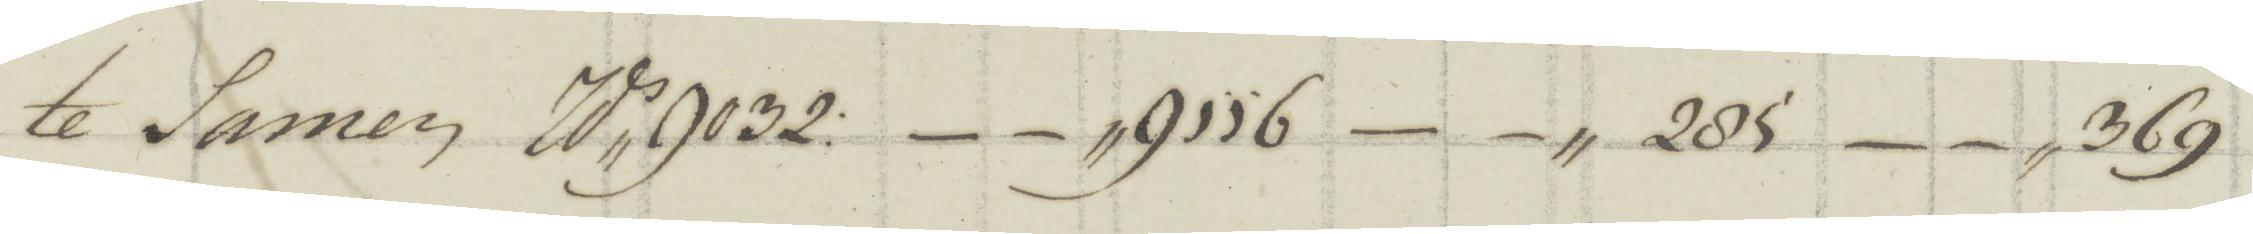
te samen rd„s 9032: — — „9556 — — „ 285 — — „ 369
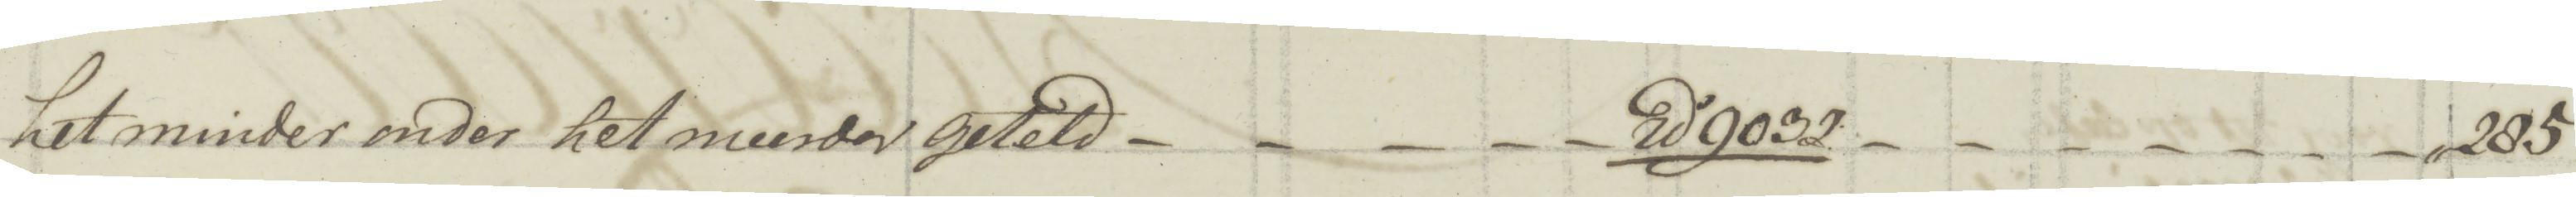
het minder onder het meerder geteld — — — — — rds 9032: – – – – – – – „285
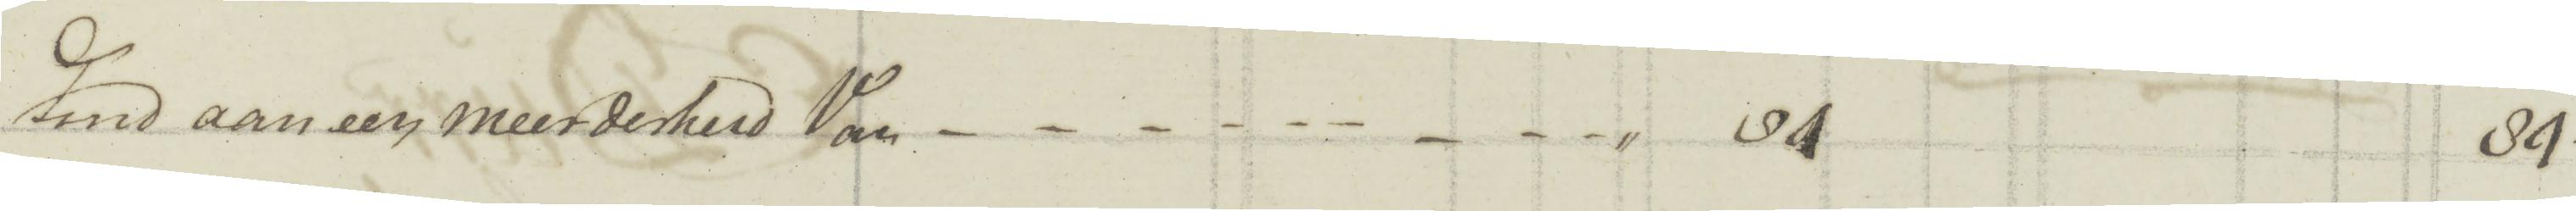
Tind aan een meerderheid van – – – – – – – – – „ 84 84
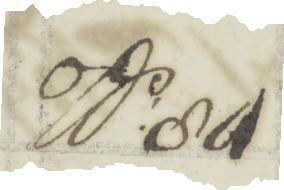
opp: 84
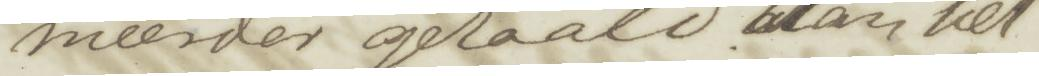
meerder gehaald aan het
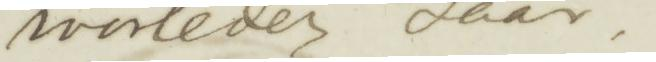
voorleden Iaar,
